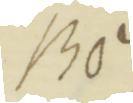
1307
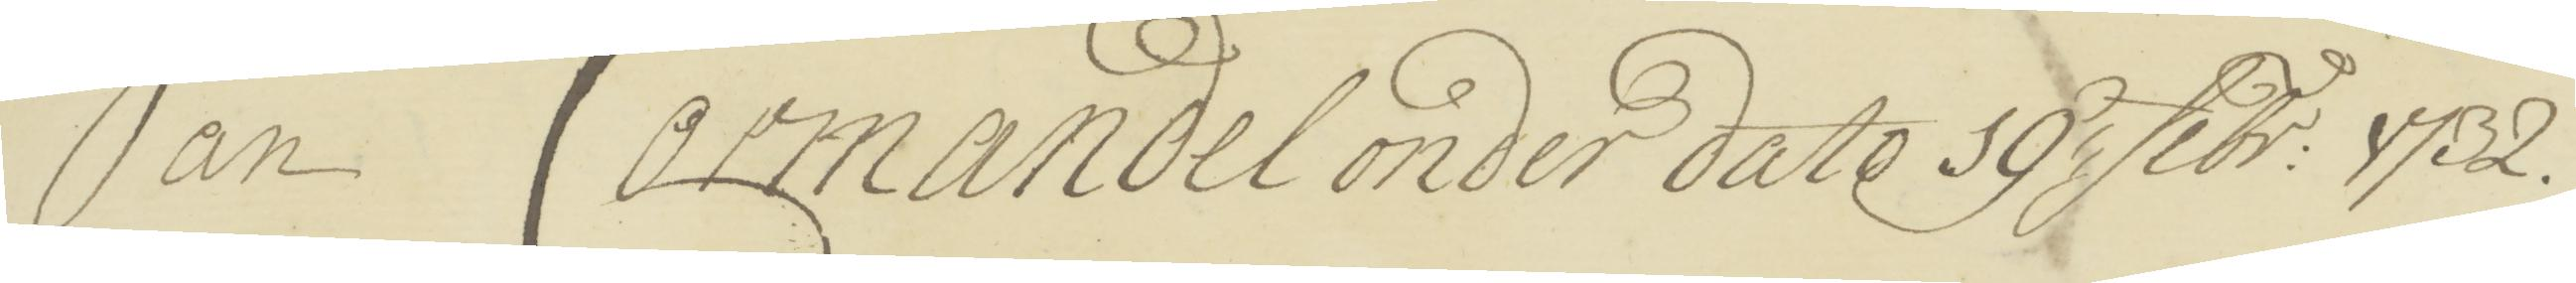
Van Cormandel onder dato 19„' febr: 1732.
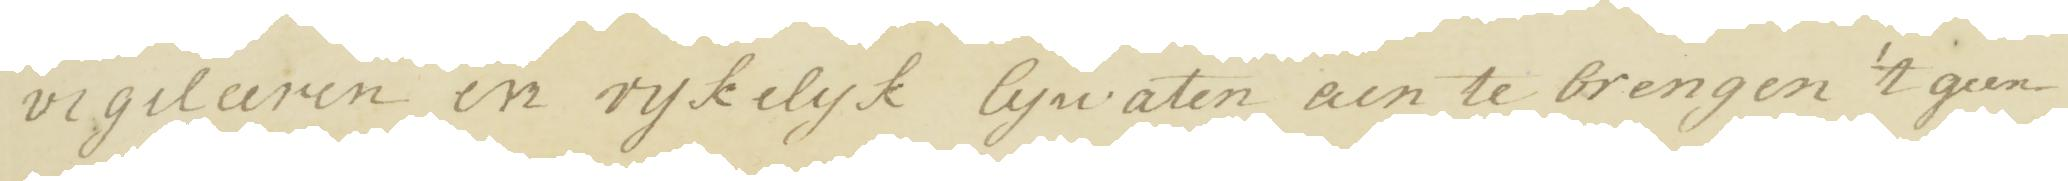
vigileeren en rykelyk lywaten aen te brengen 't geen
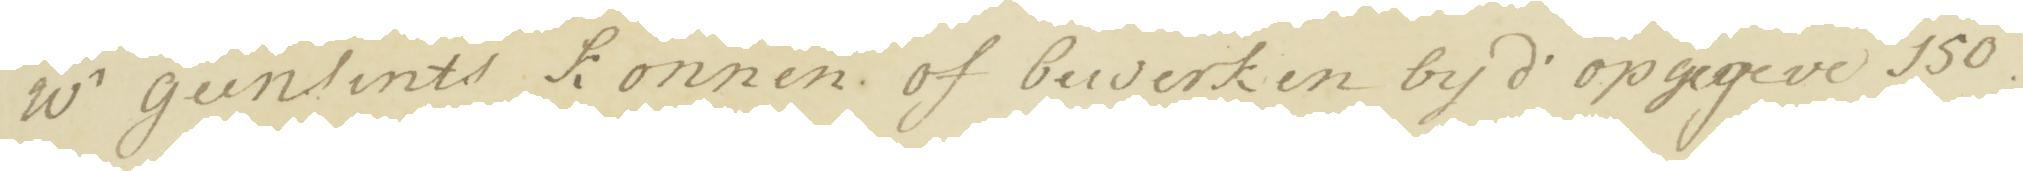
w' geensints konnen of bewerken by d' opgegeve 150
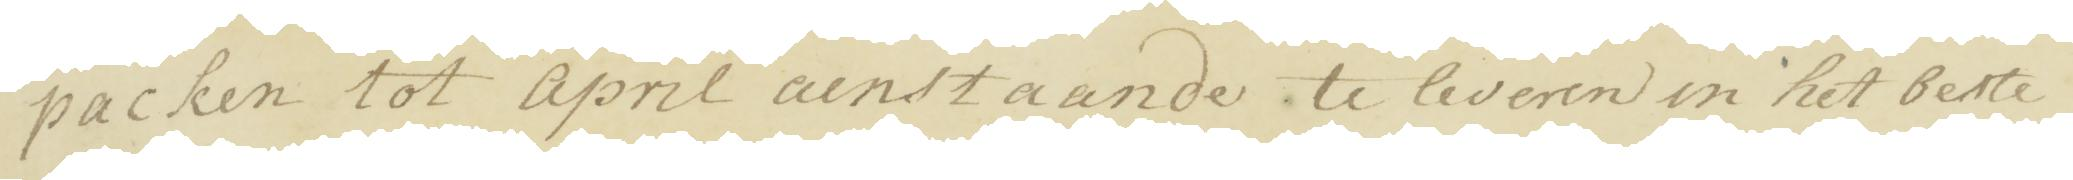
packen tot april aenstaande te leveren in het beste
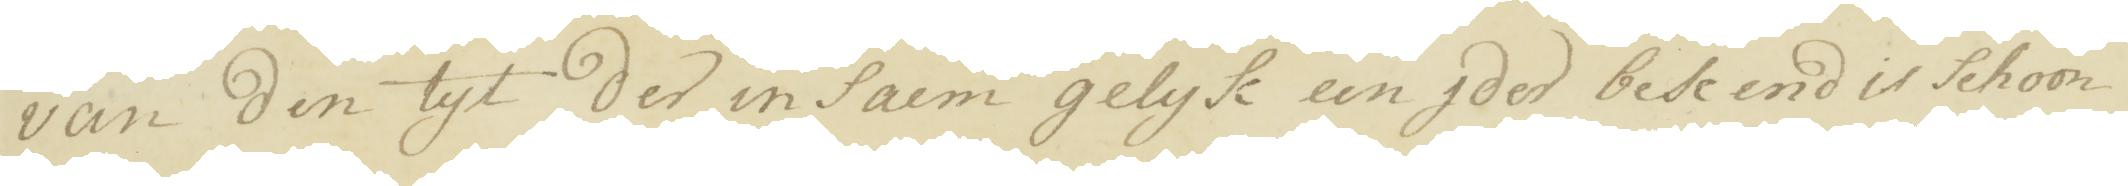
van den tyt der in saem gelyk een jder bekend is schoon
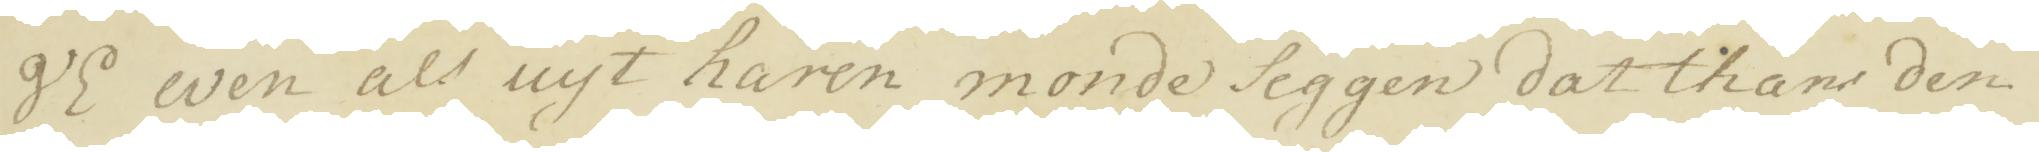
VE even als uyt haren monde seggen dat thans den
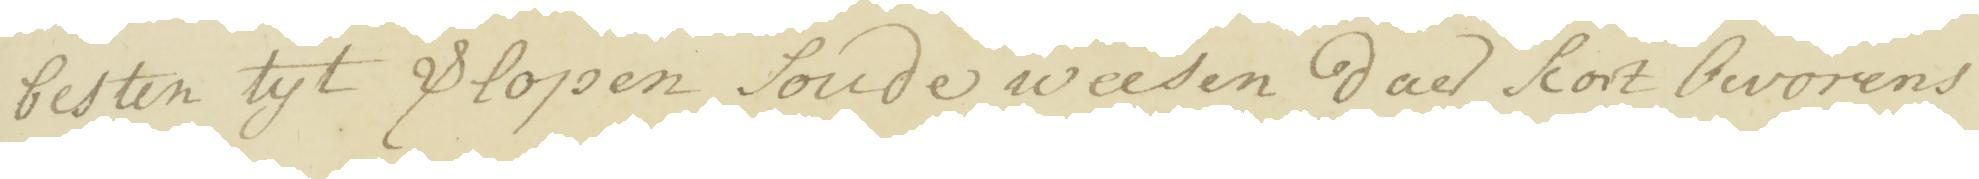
besten tyt verlopen soude weesen daer kort bevorens
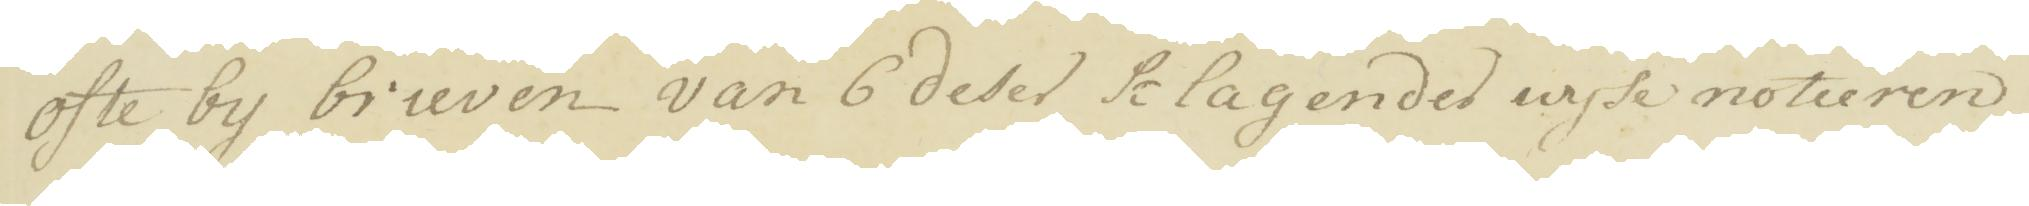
ofte by brieven van 6 deser klagender wyse noteeren
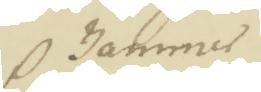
Jammer
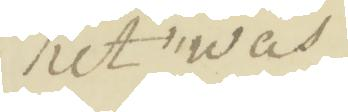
het „ was
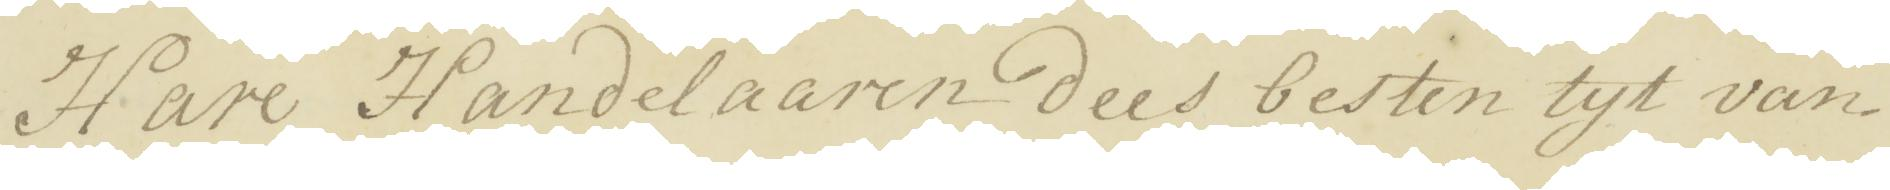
Hare Handelaaren dees besten tyt van
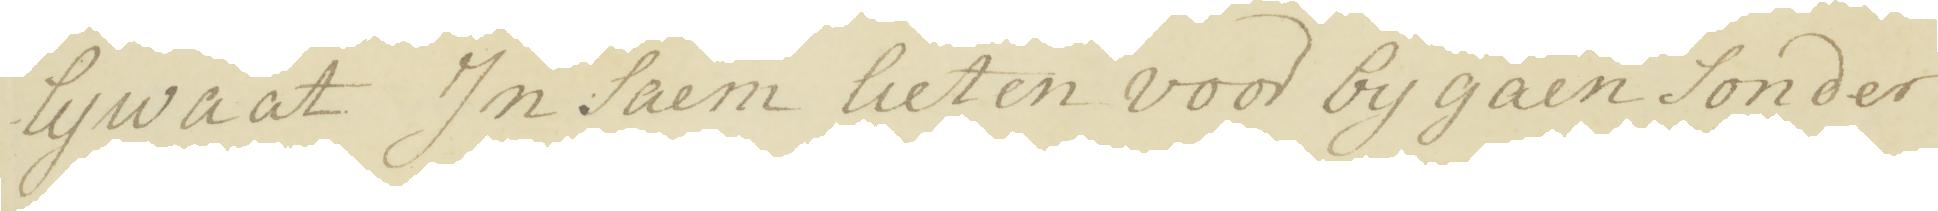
lywaat Jnsaem lieten voor by gaen sonder
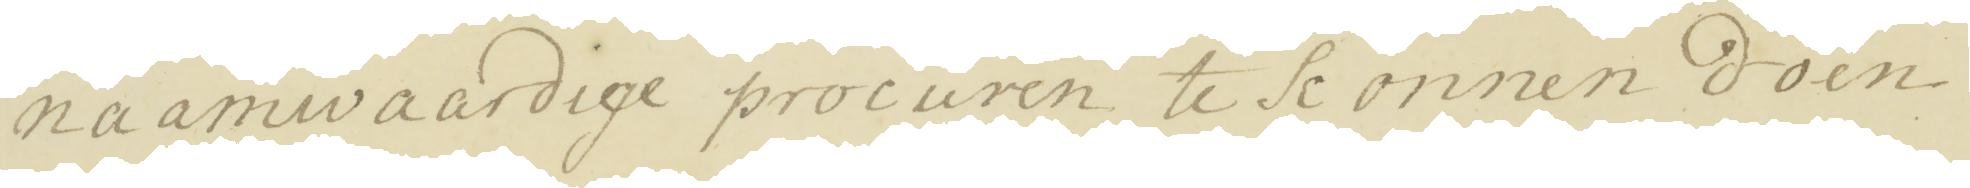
naamwaardige procuren te konnen doen
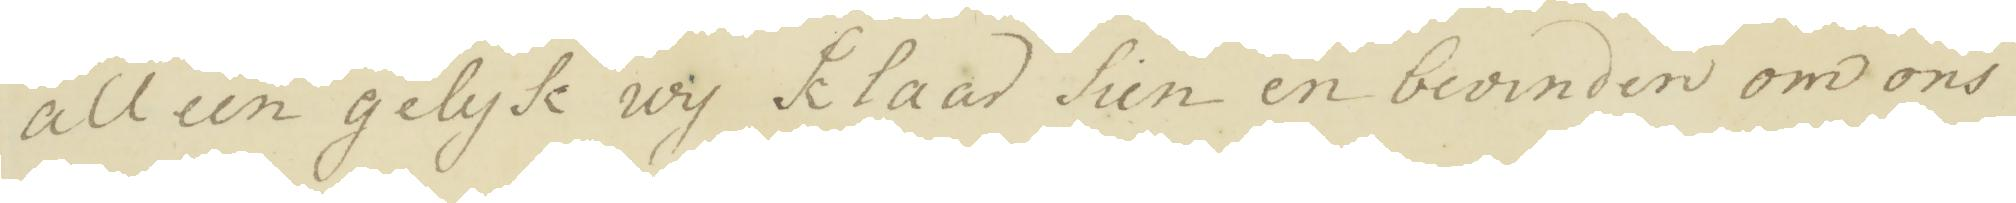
alleen gelyk wy klaar sien en bevinden om ons
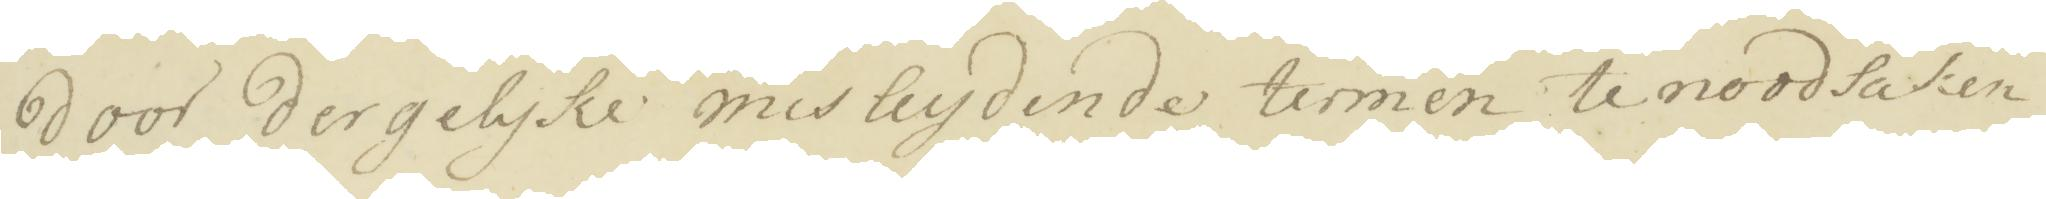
door dergelyke misleydende termen te noodsaken
